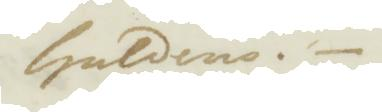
Guldens. —
